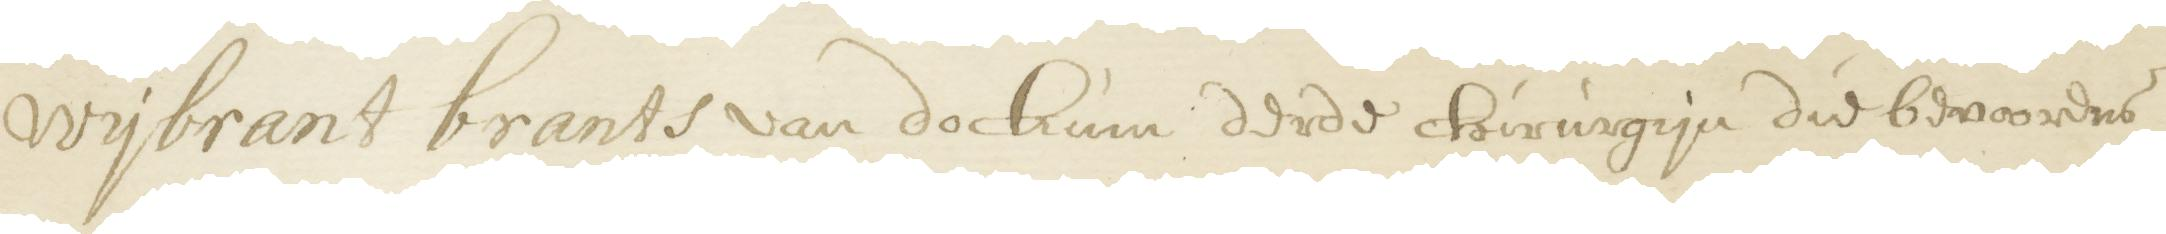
Wijbrant brants van dockum derde chirurgijn die bevoorens
